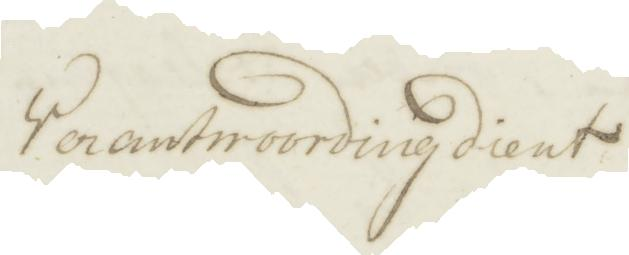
Verantwoording dient
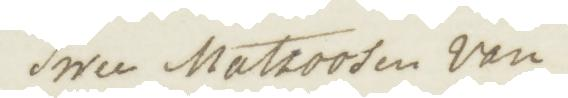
Twee Matroosen van
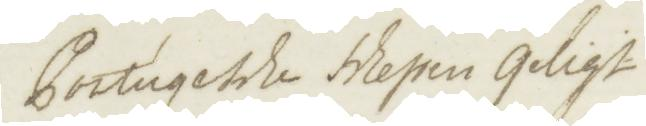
Portugesche Schepen geligt
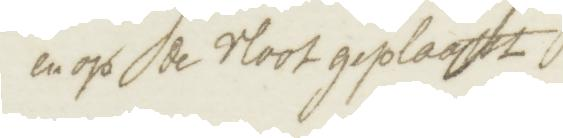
en op de Vloot geplaatst.
